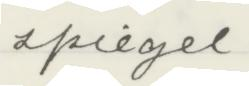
spiegel
